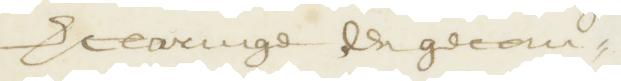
verclaringe der gecom„
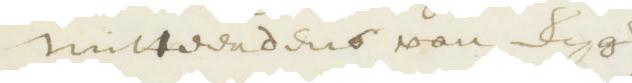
mitteerdens van Eygen
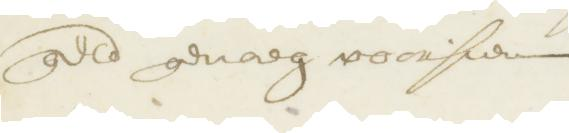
geld genoeg voorsien
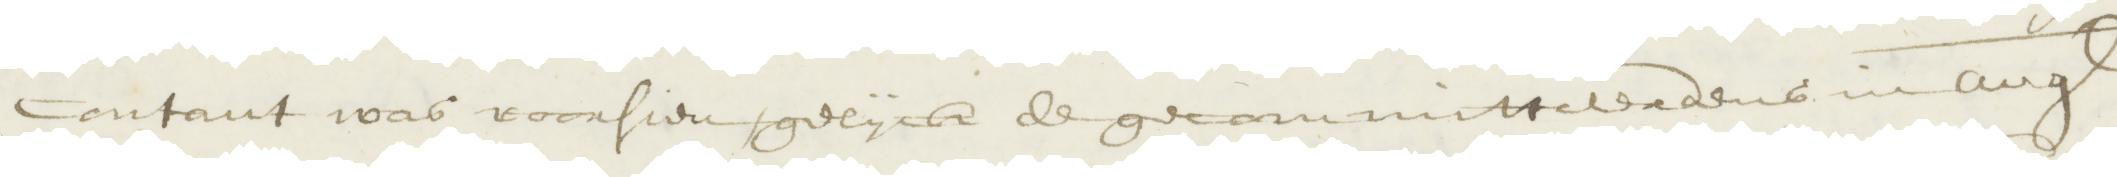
contant was voorsien gelijck de gecommitteerdens in aug
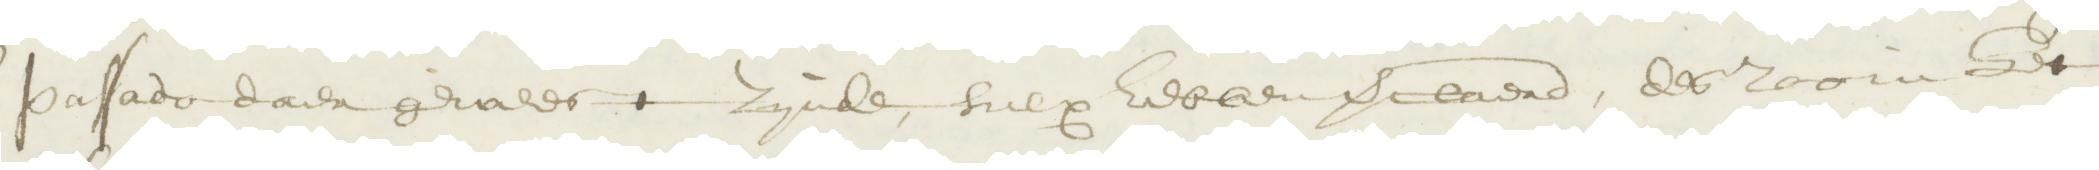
passado daer geweest zijnde, sulx hebben verclaerd, des Zoo in het
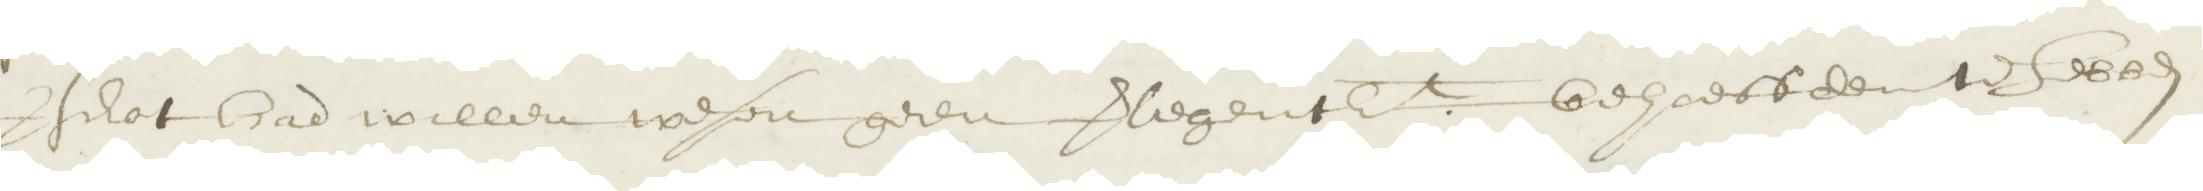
schot had willen wesen geen verlegenth.t behoess den te hebben
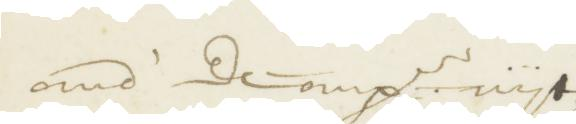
omd’ Ecomp:e nijt
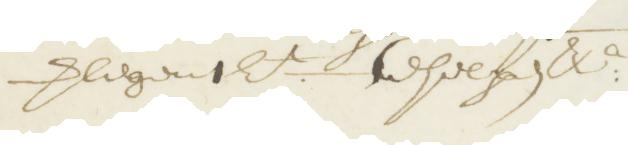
verlegenth.t tehelpen &:a
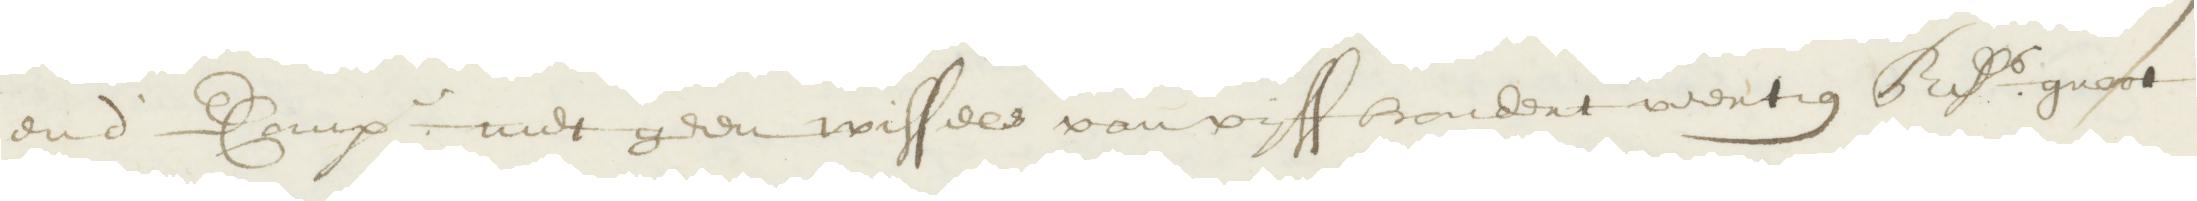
en d’ EComp:e met geen wissels van vijff hondert veertig Press. groot
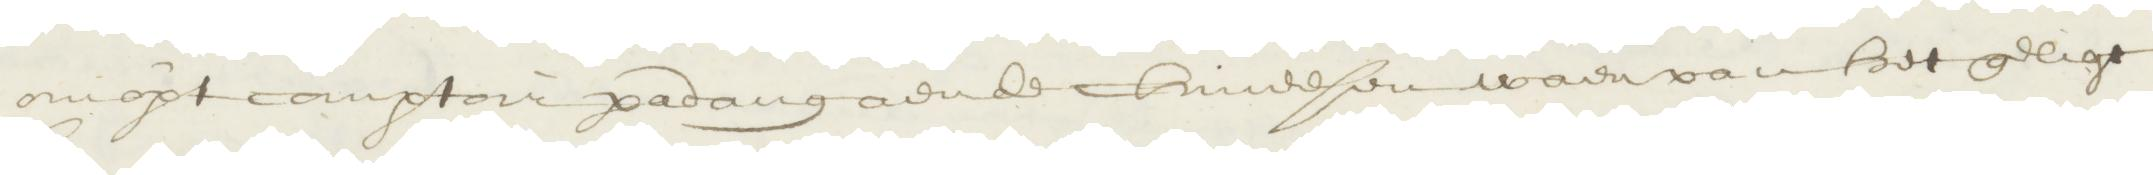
om op 't comptoir padang aende chineesen waer van het geligt
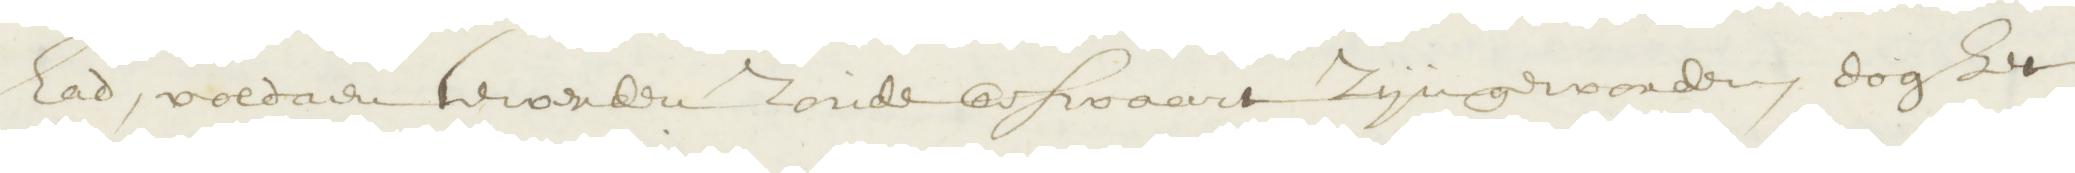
had, voldaen tewerden Zoude beswaart Zijn geworden, dog het
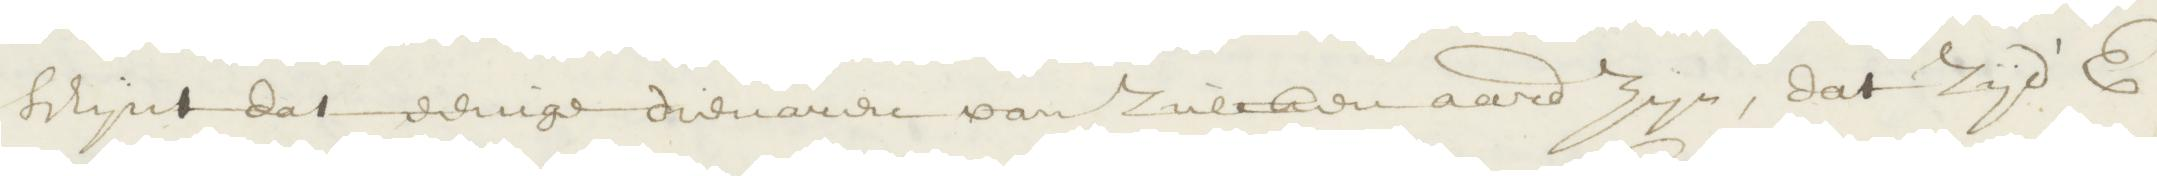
schijnt dat eenige dienaren van Zulcken aard zijn, dat Zijd' E
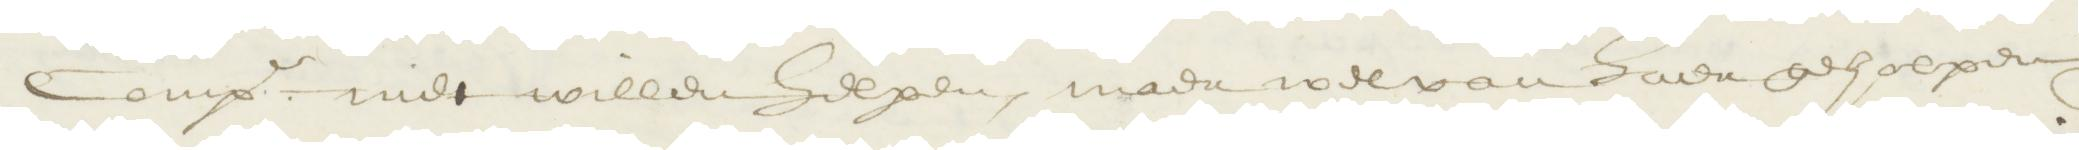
Comp:e niet willen helpen, maer wel van haer geholpen
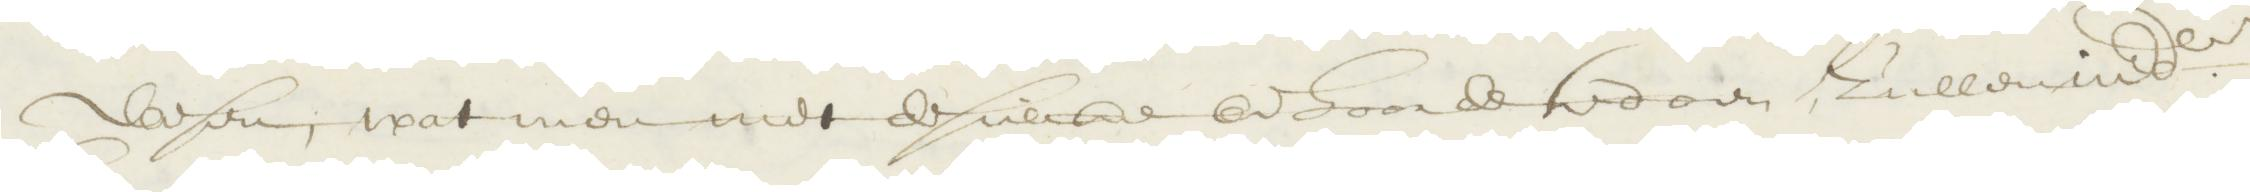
wesen, wat men met desulcke behoorde te doen, Zullen ind.en
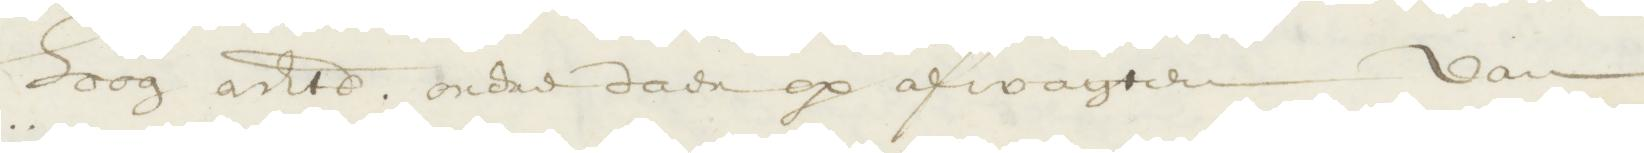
hoog achtb. ordre daer op afwagten van
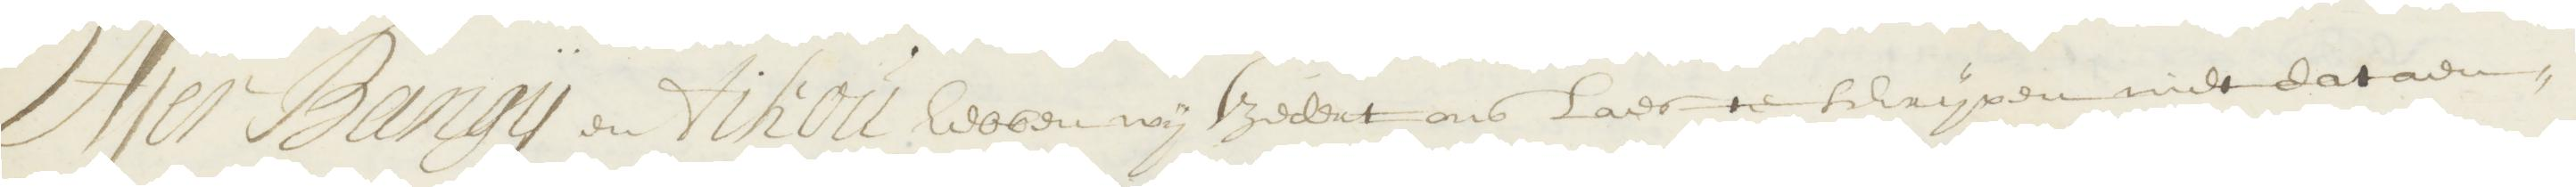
Ajer Bangij en tikou hebben wij tzedert ons laeste schrijven niet dat aen„
